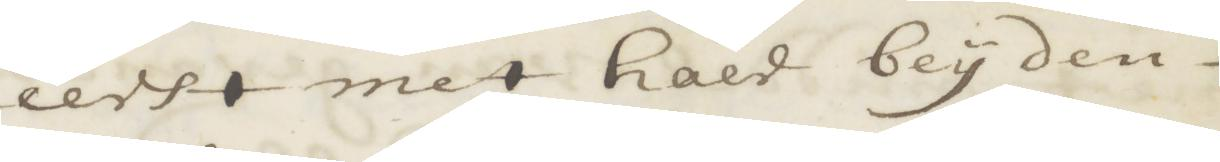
eerst met haer beijden —
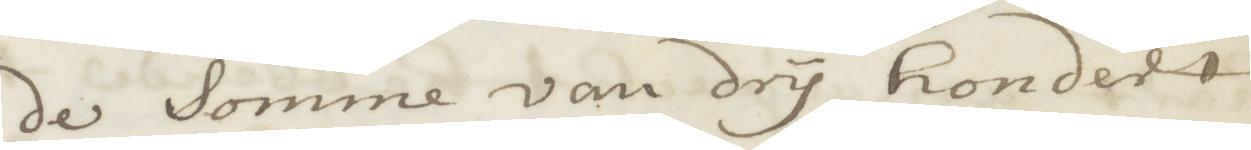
de somme van drij hondert
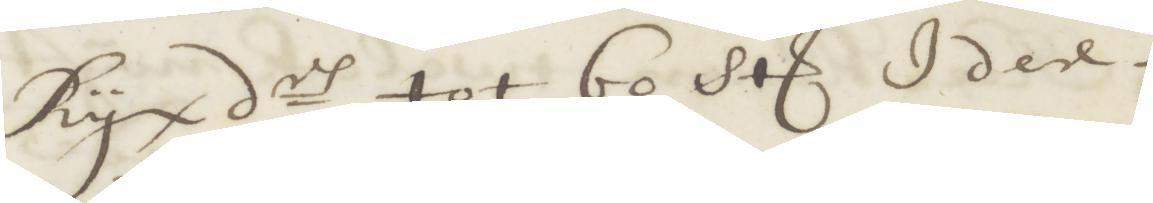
Rijxd=rs tot 60 stver Ider
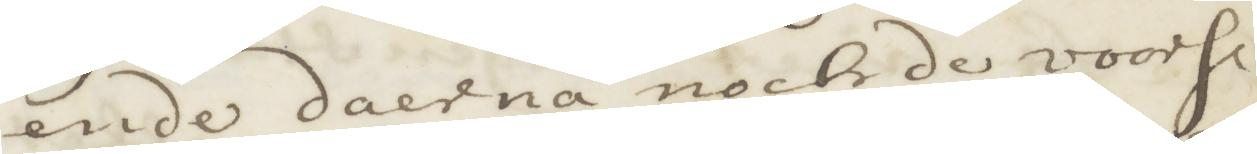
ende daerna noch de voors
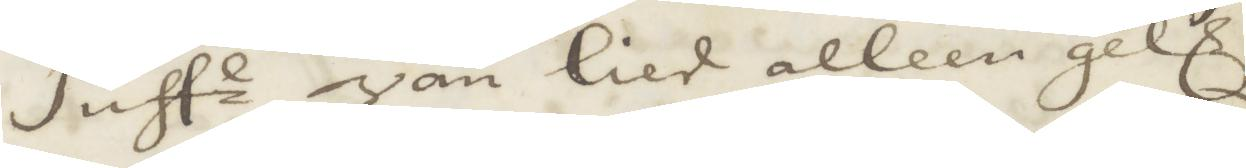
Iuff=e van Lier alleen gel
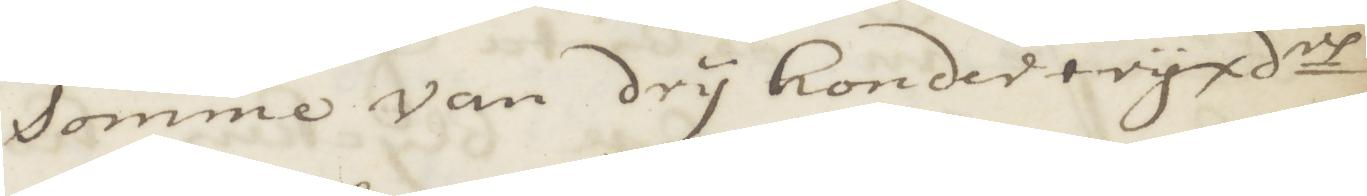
somme van drij hondert rijxd=rs
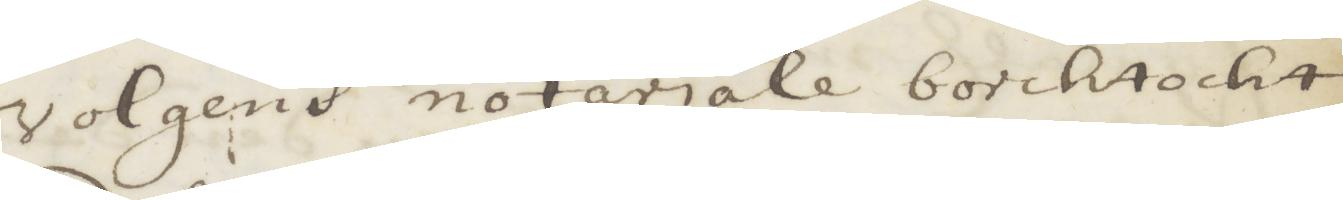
volgens notariale borchtocht
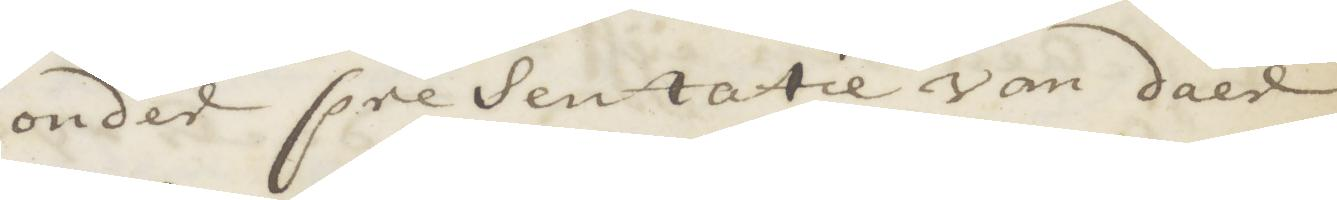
onder presentatie van daer
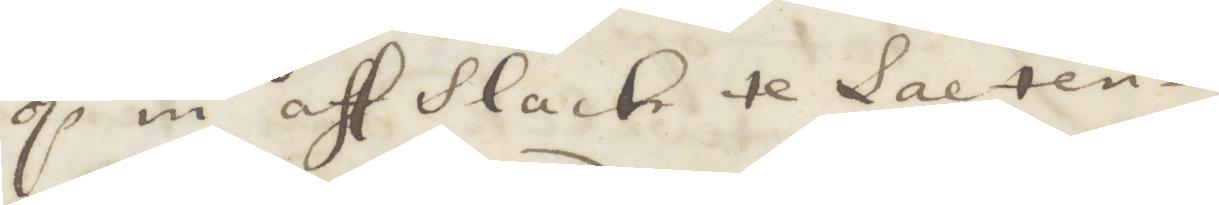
op in aff slach te Laeten —
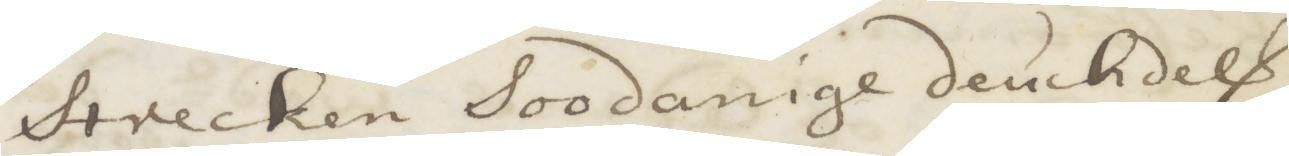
strecken soodanige deuchdel
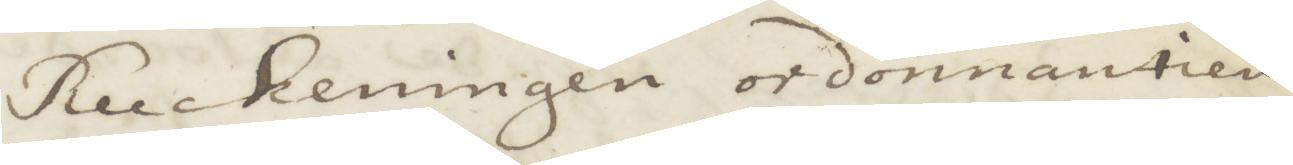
Reeckeningen ordonnantien
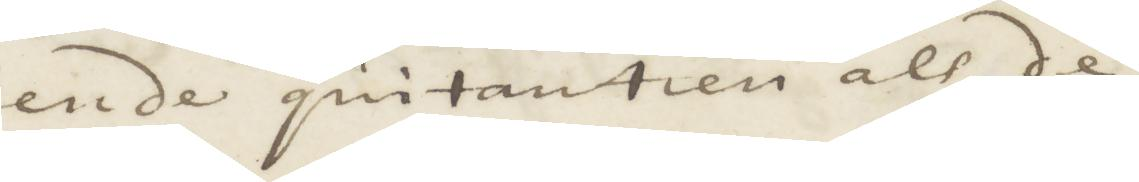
ende quitantien als de
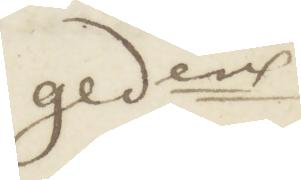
ged=ens
